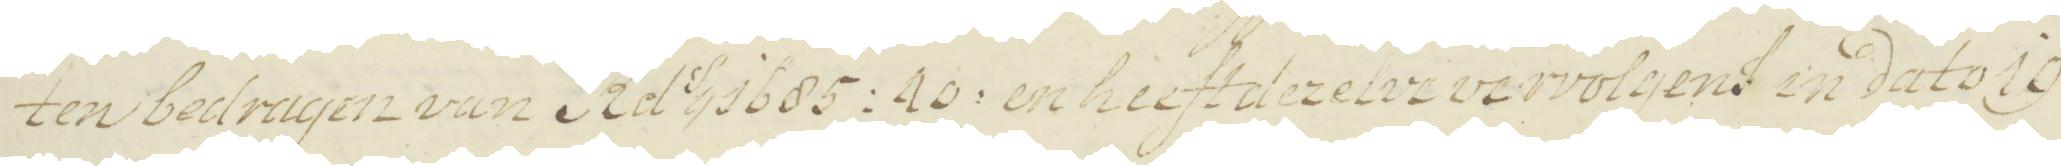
ten bedragen van Rd„s 1685: 40: en heeft dezelve vervolgens in dato 19
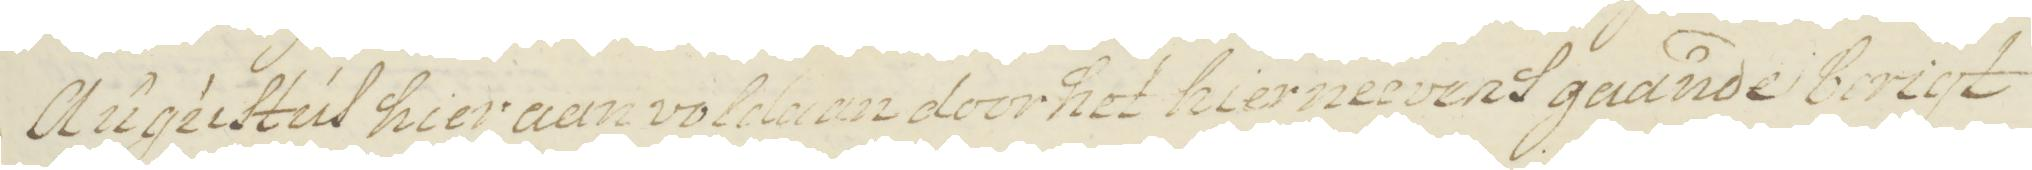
Augustus hier aan voldaan door het hier neevens gaande berigt
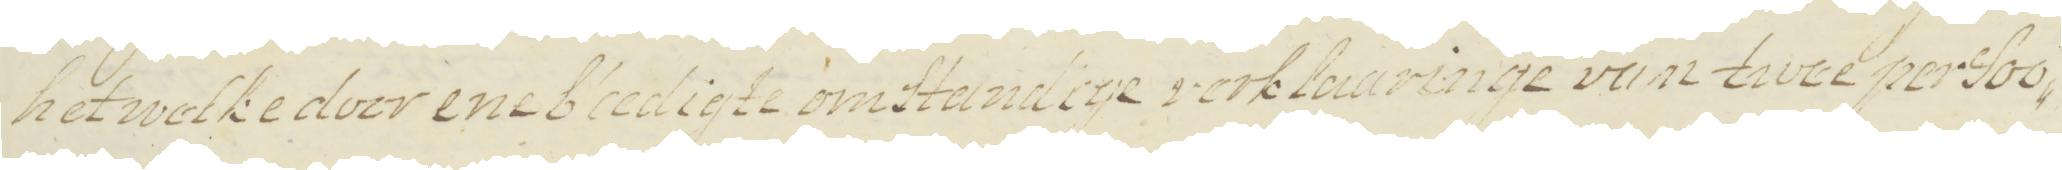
het welke door ene b'eedigte omstandige verklaaringe van twee persoo„
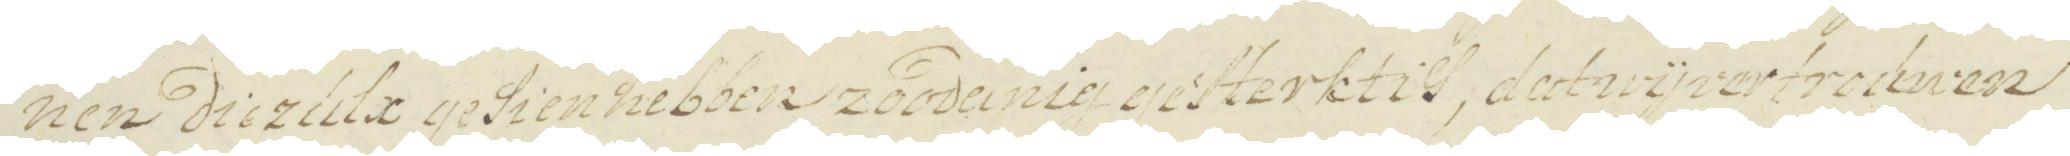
nen die zulx gesien hebben zoodanig gesterkt is, dat wij vertrouwen
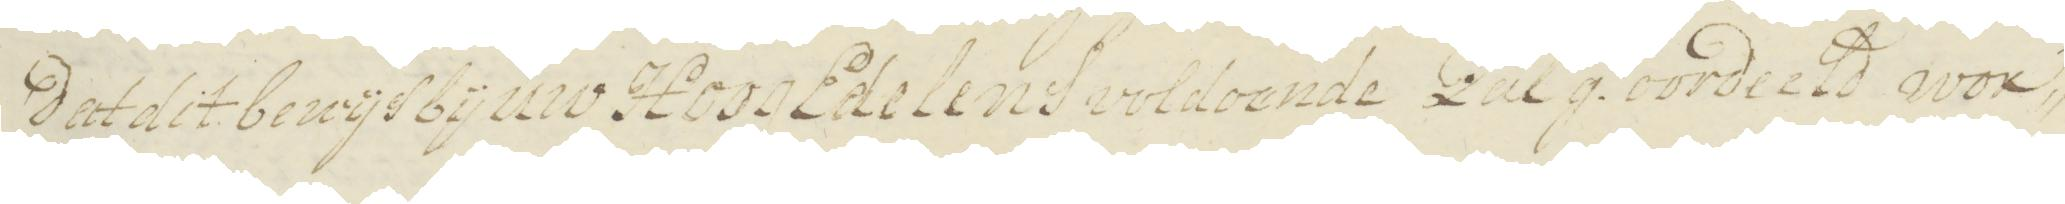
dat dit bewijs bij uw Hoog Edelens voldoende zal g'oordeeld wor„
